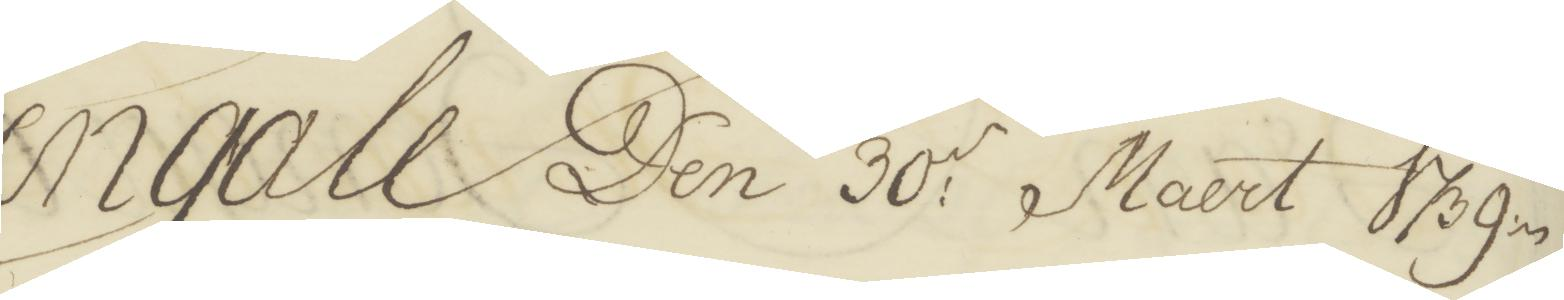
van Bengale Den 30:' Maert 1739
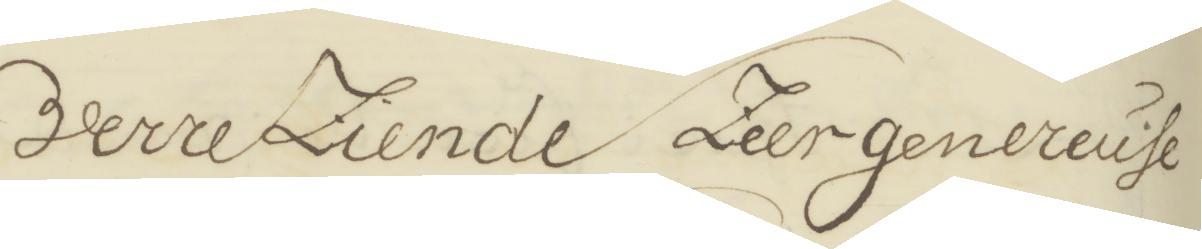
Verreziende zeer genereuse
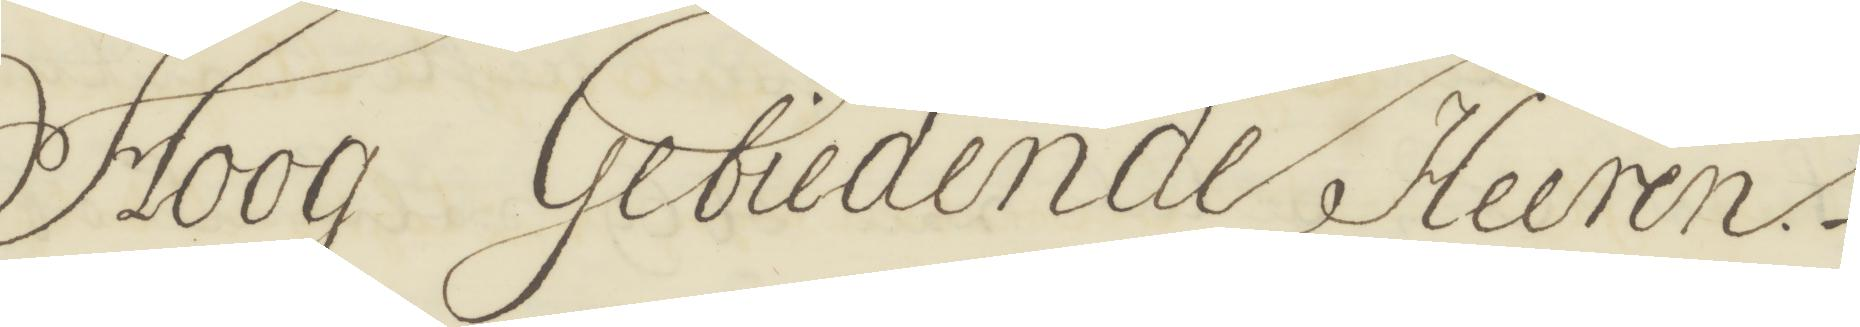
Hoog Gebiedende Heeren.
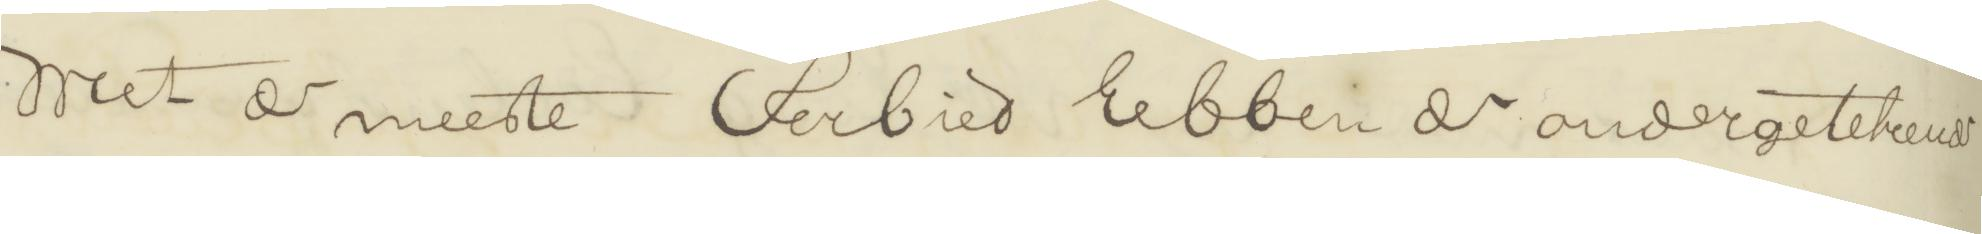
met de meeste Eerbied hebben de ondergetekende
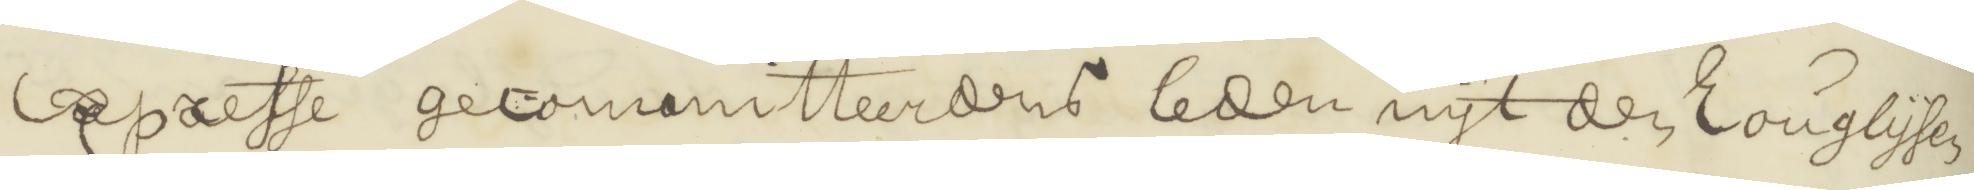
expresse gecomomitteerdens leden uijt den houglijsen
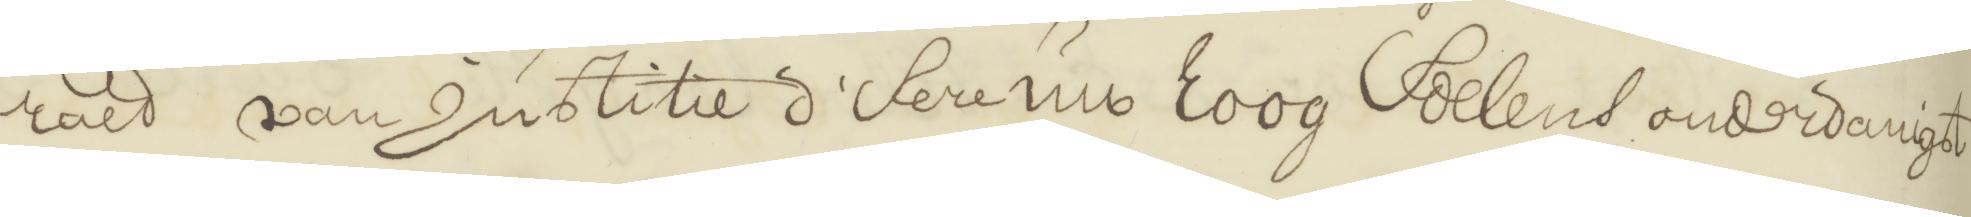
raed van justitie d’Eere uw hoog Edelens onderdanigst
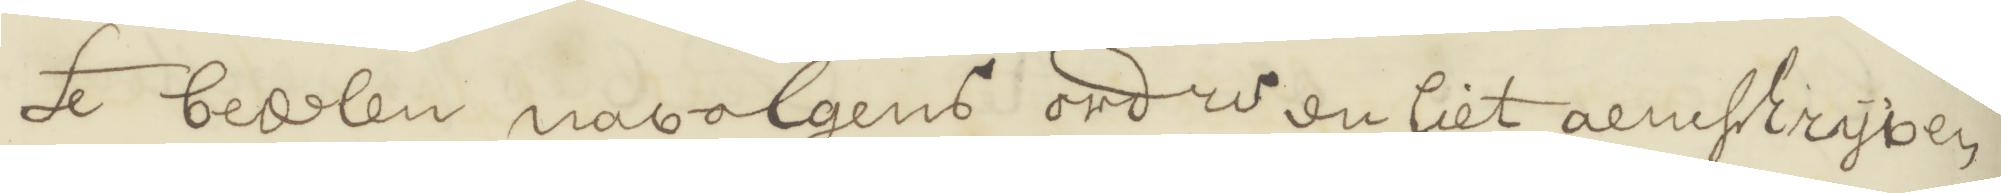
te bedelen navolgens ordre en liet aenschrijven
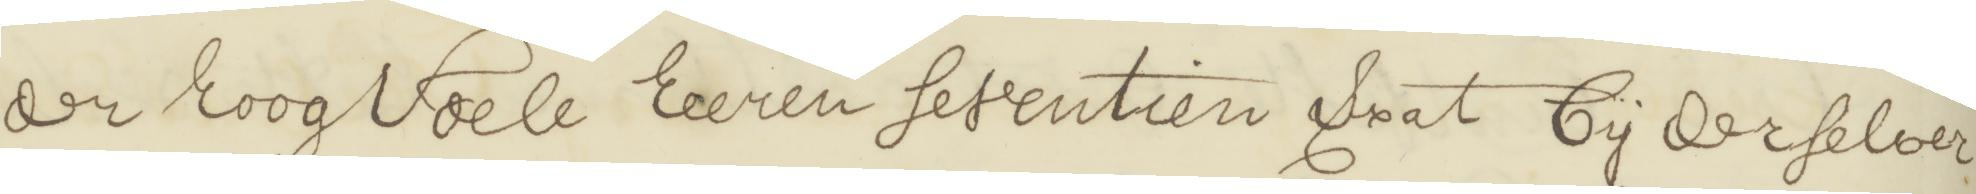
der hoog Edele heeren seventien vervat bij derselver
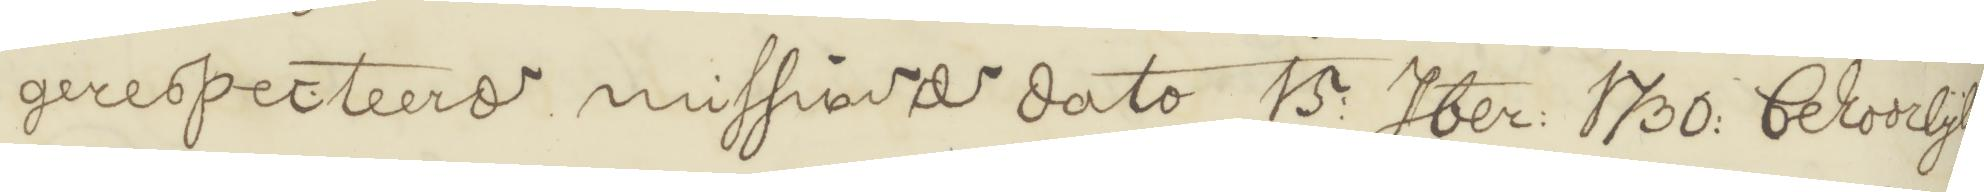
gerespecteerd missivede dato 15: 7ber: 1730: behoorlijk
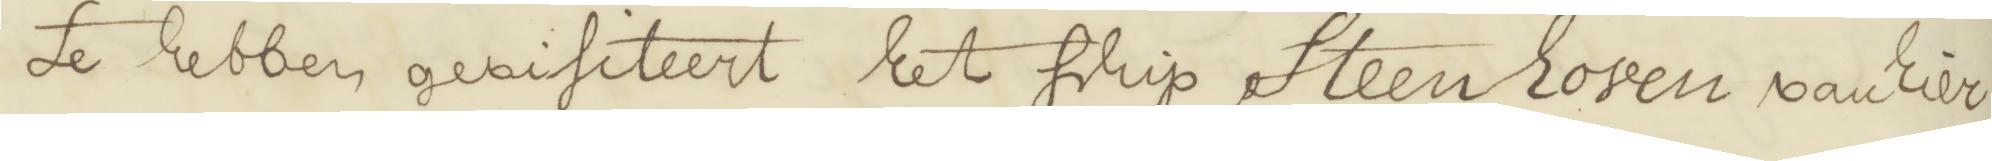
te hebben gevisiteert het schip Steenhoven van hier
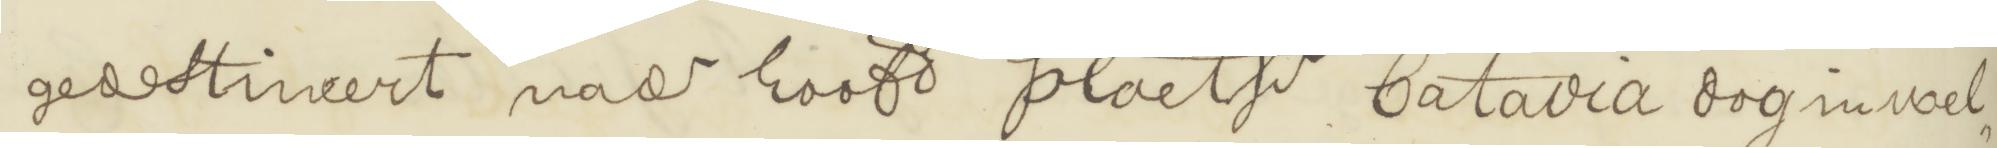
gedestineert nade hoofd plaetse batavia dog in wel„
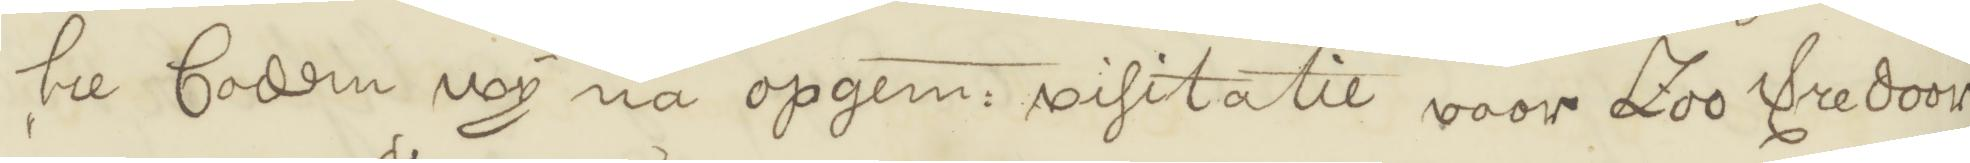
„ke bodem wij na opgem: visitatie voor zoo verre door
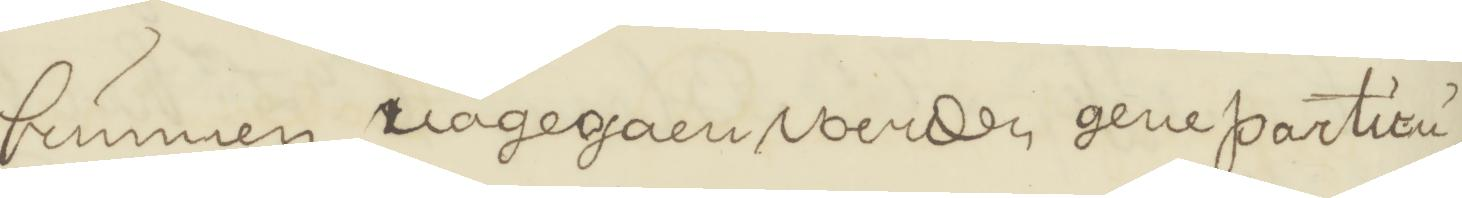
ons heeft kunnen nagegaen werden gene particu„
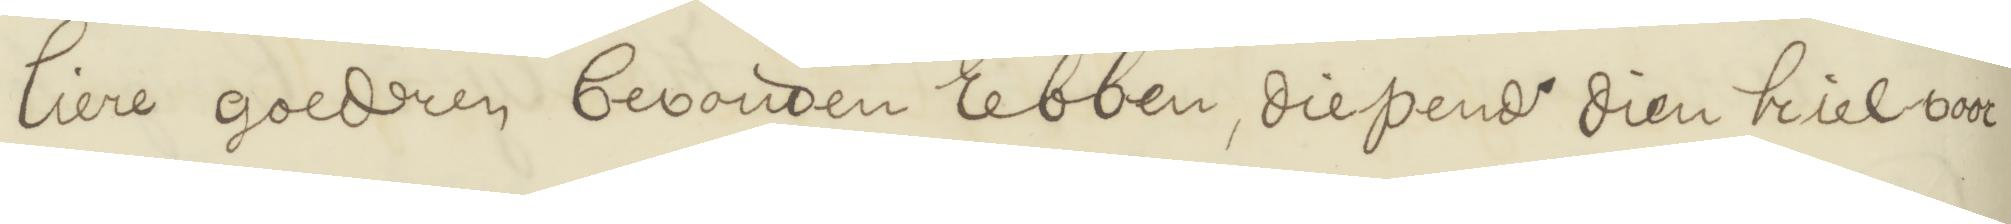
liere goederen bevonden hebben, diepende dien kiel voor
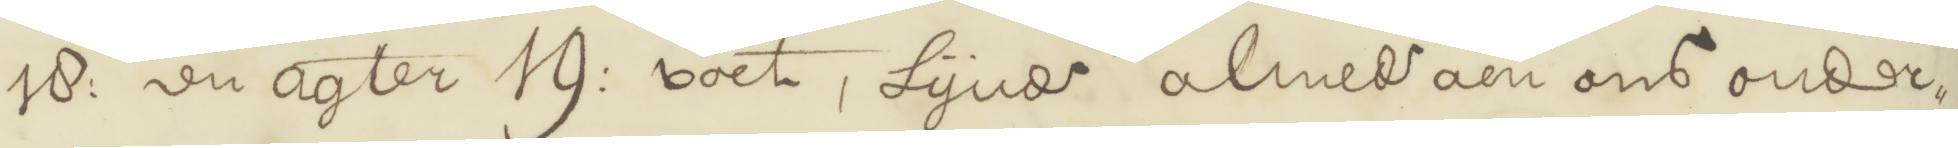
18: en agter 19: voet, sijnde almede aen ons onder„
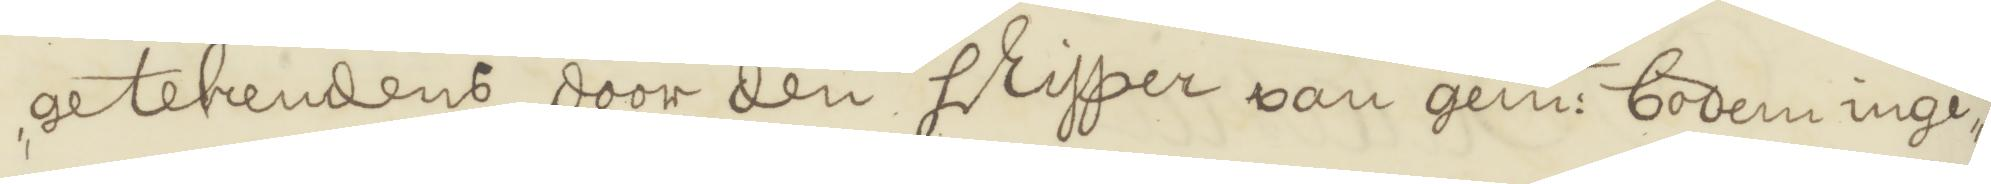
„getekendens door den schipper van gem: bodem inge„
